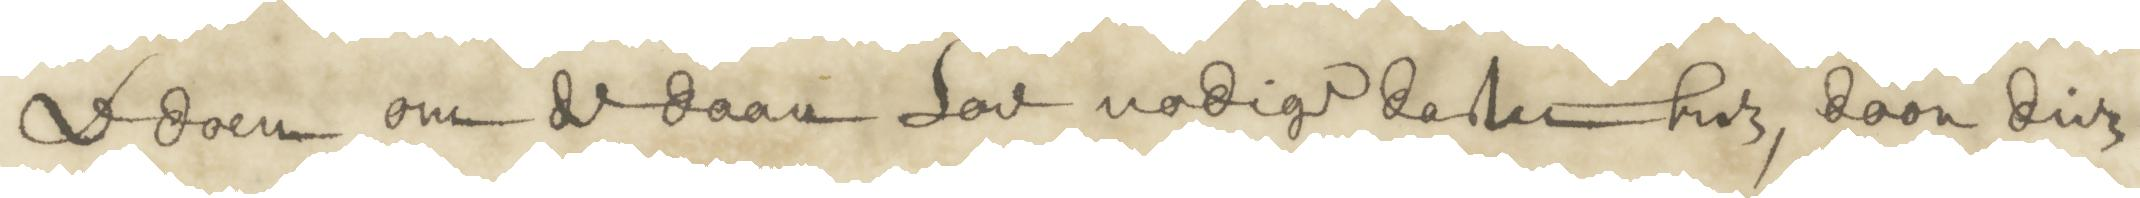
te doen om de daar toe nodige dasticken, door dien
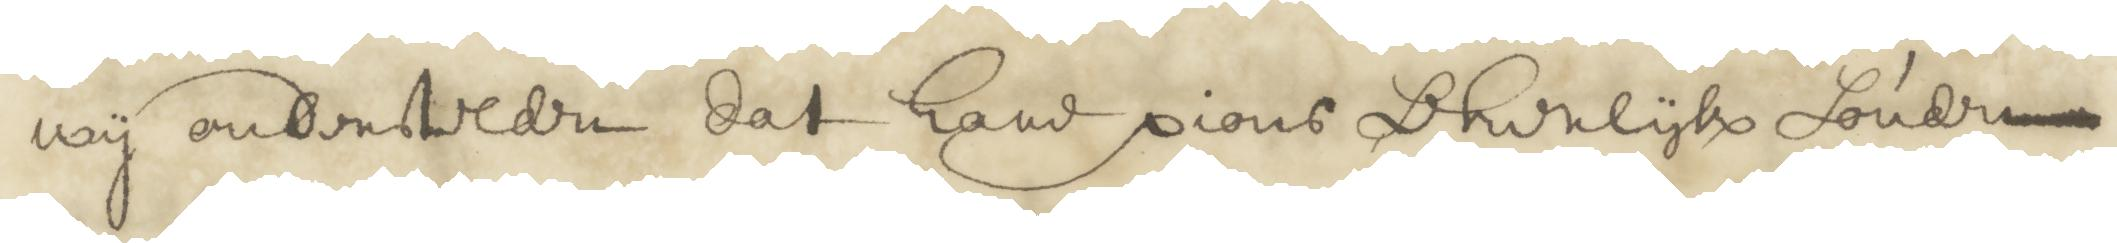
wij onderstelden dat hare pions sekerlijk souden
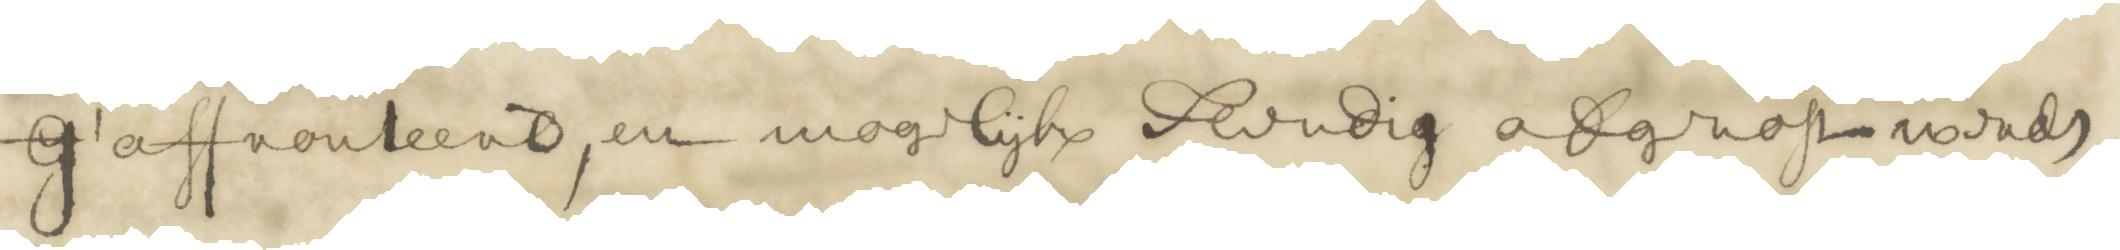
g’affronteerd, en mogelijk Elendig afgerost werden,
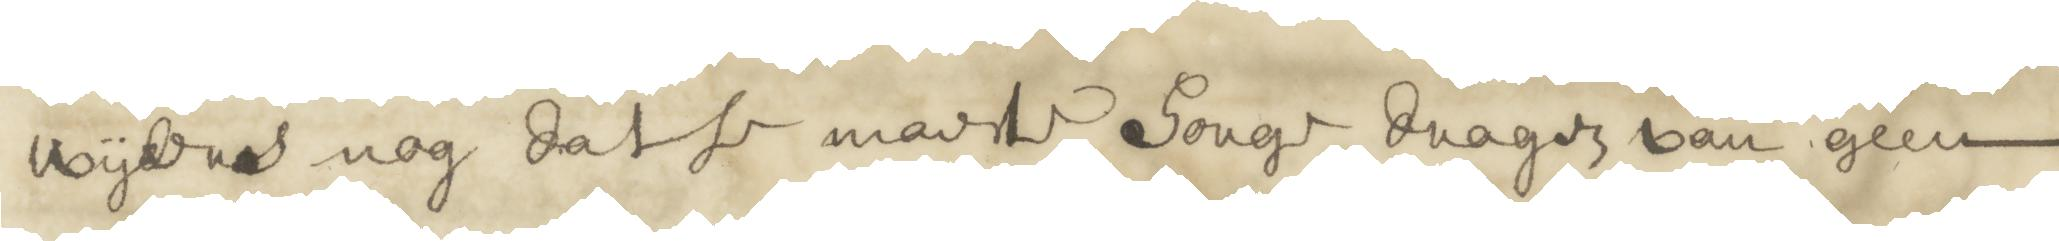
wijders nog datse moeste sorge dragen van geen
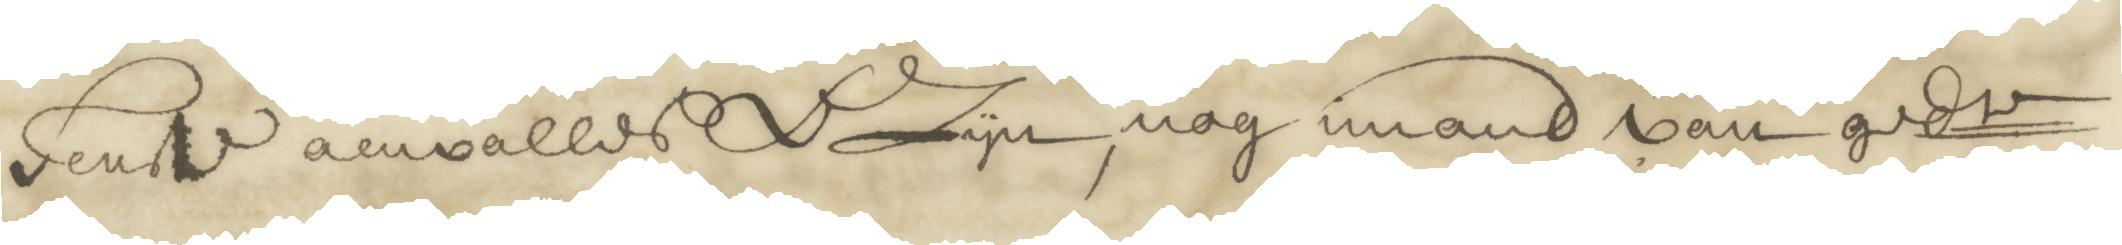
Eerste aenvalles te zijn, nog imand van ged=te
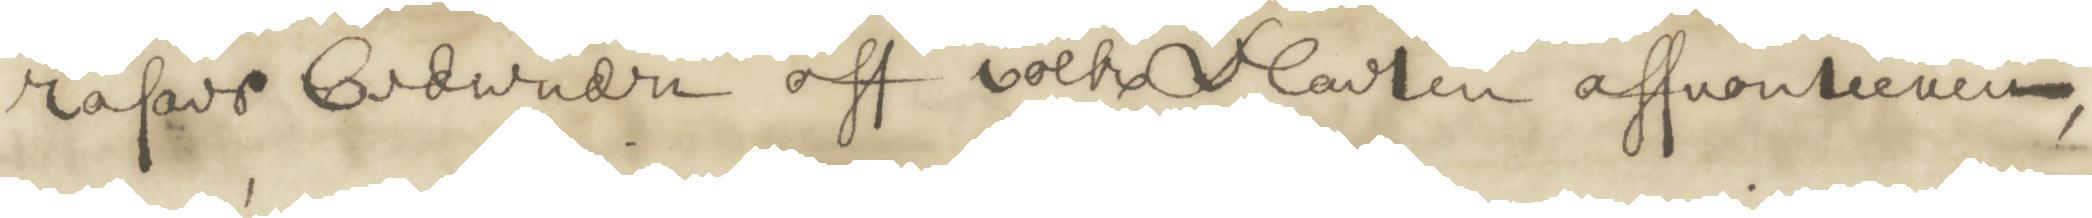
rasaes bedienden off volk telaeten affronteeren,
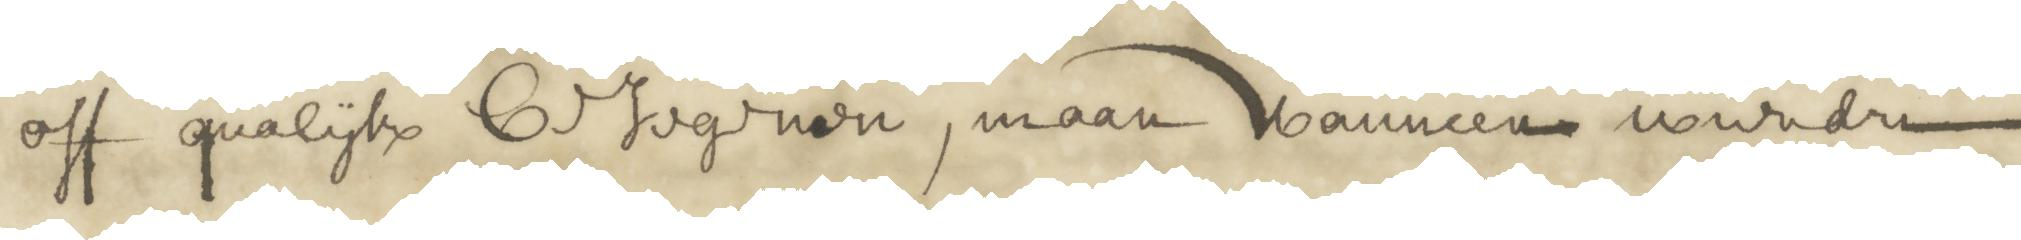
off qualijk bejegenen, maar Wanneer wierden
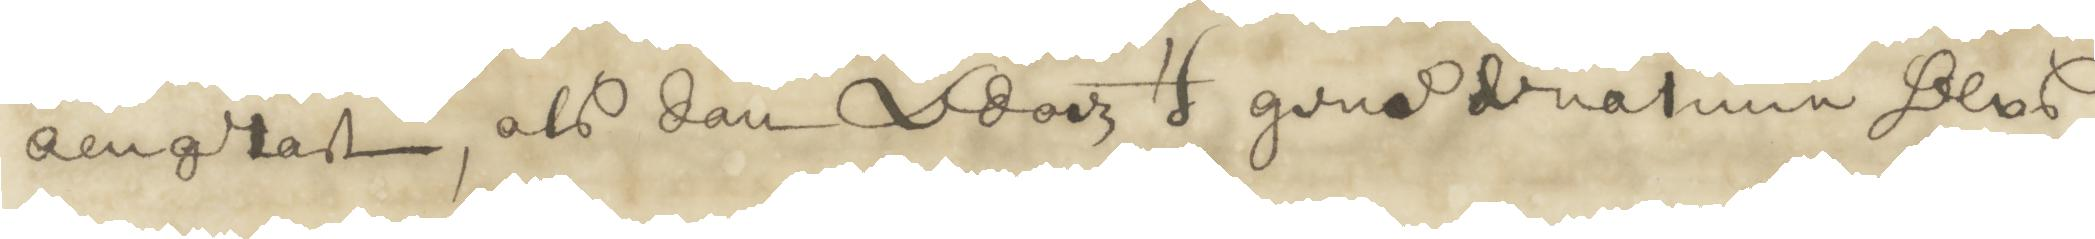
aengetast, als dan te doen ’t gene de natuur selvs
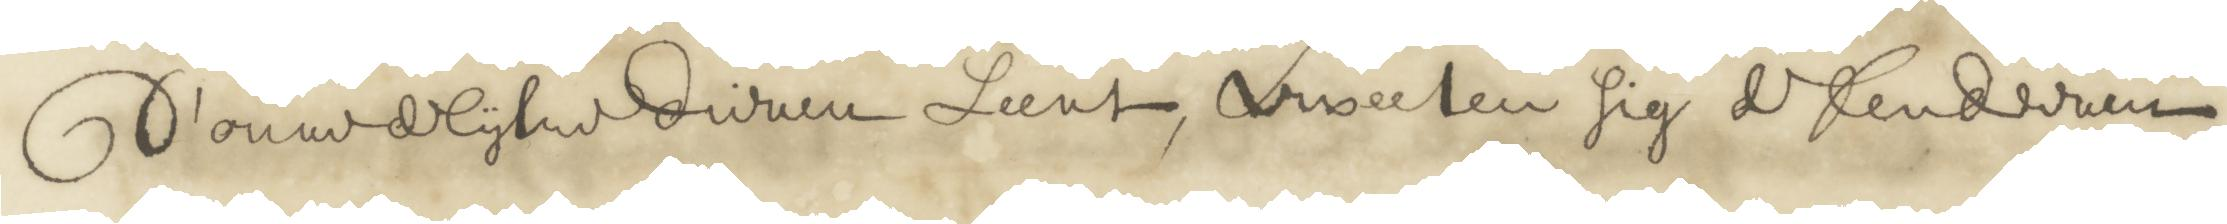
d’onredelijke dieren Leert, teweeten sig defendeeren,
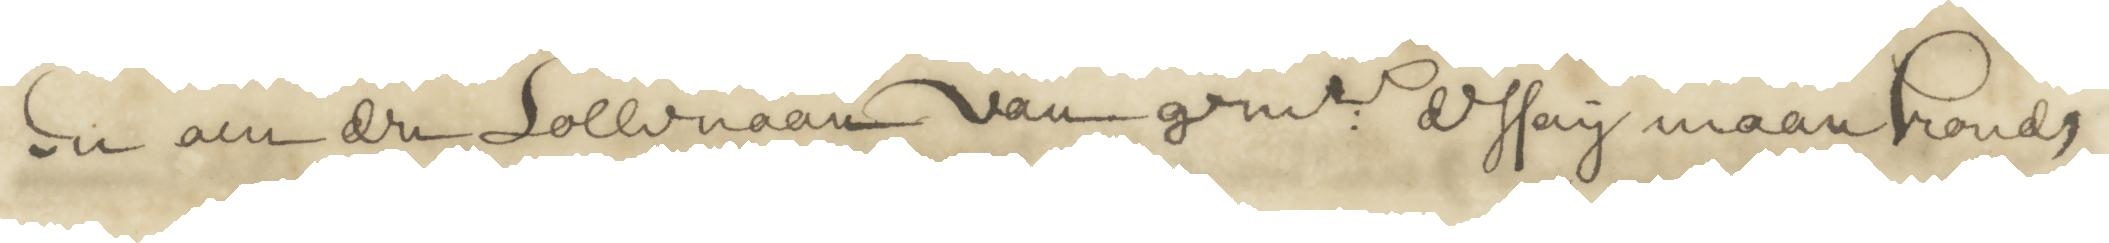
en aen den tollenaar van gem:te dessaij maar konden
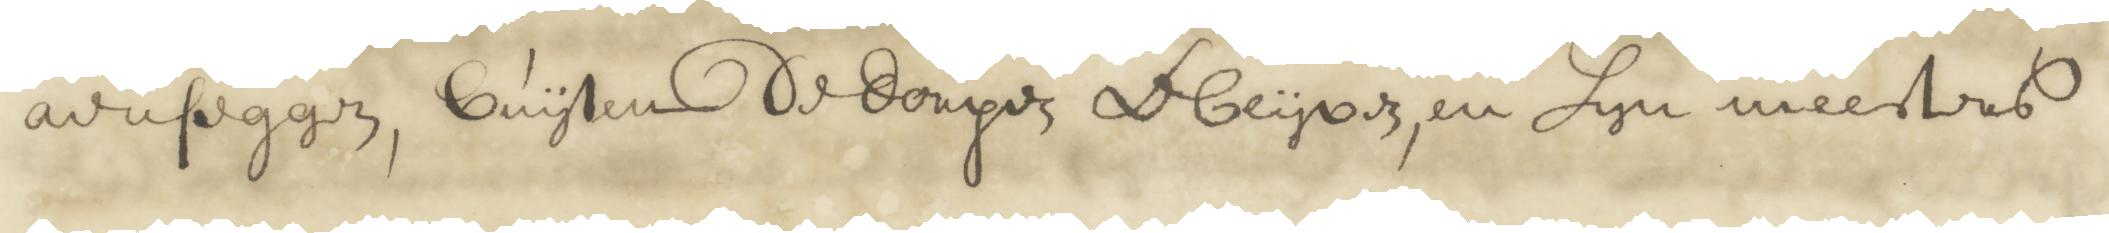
aenseggen, buijten de dorpen teblijven, en syn meesters
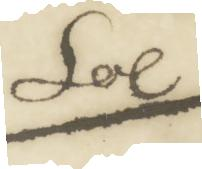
tol
